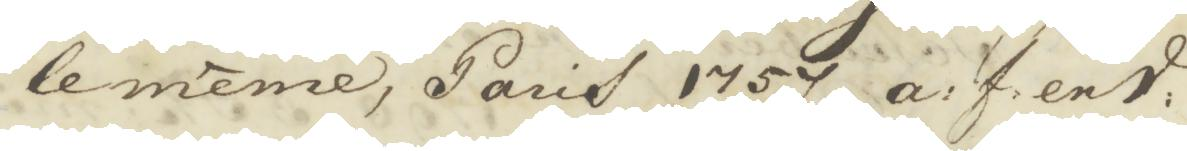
le même, Paris 1757, a: f. enV:
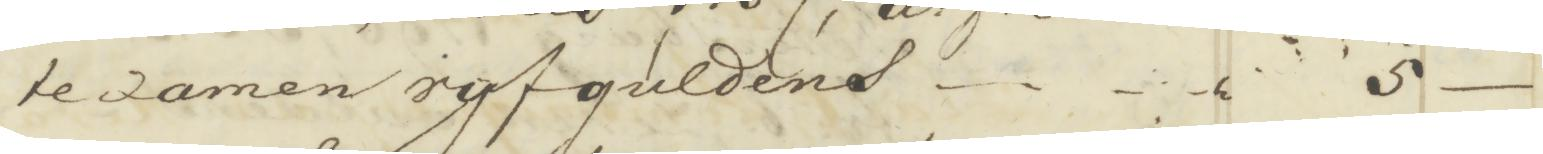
te zamen vijf guldens - - - -„ 5 —
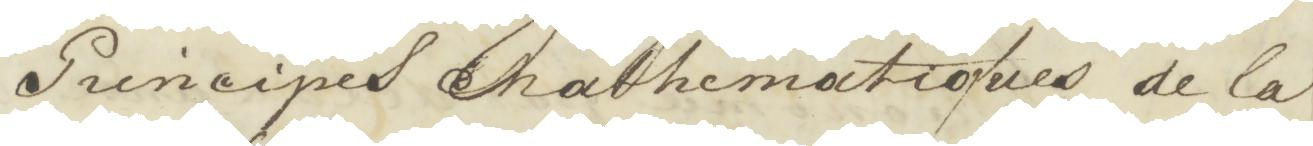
Principes mathematiques de la
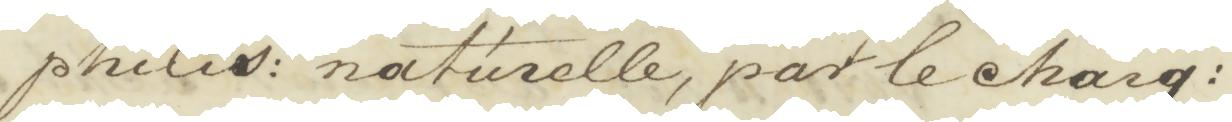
philis: naturelle, par le Marq:
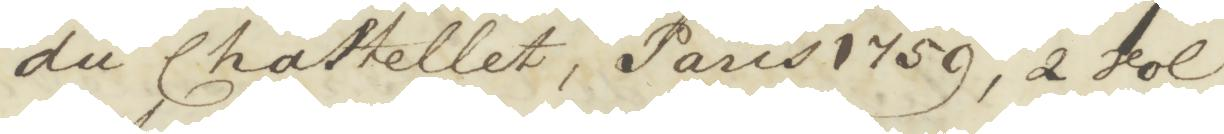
du Chastellet, Paris 1759, 2 vol
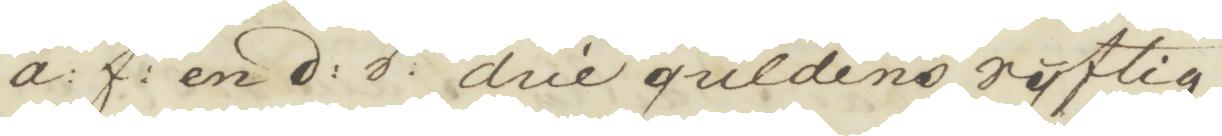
a: f: en d: v:, drie guldens vijftig
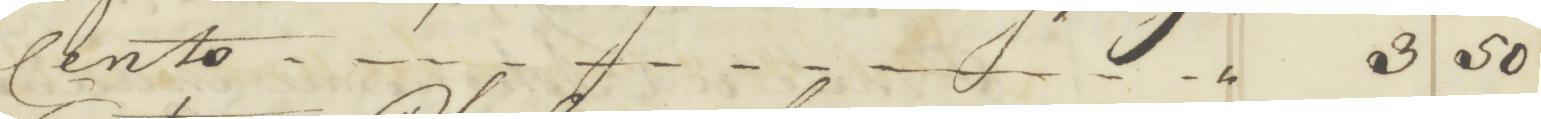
cents - - - - - - - - - - - - - „ 3 50
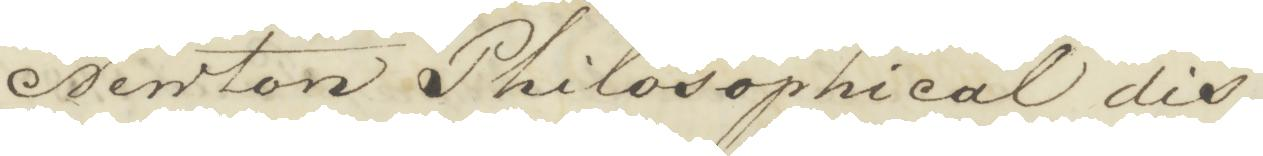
Newton Philosophical dis
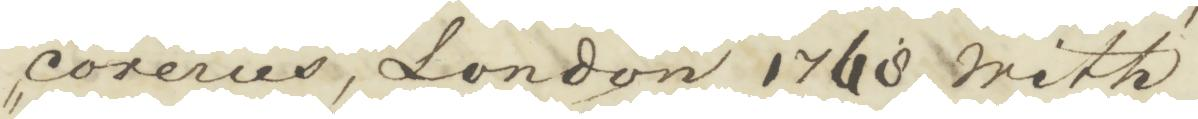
„coveries, London 1748, with
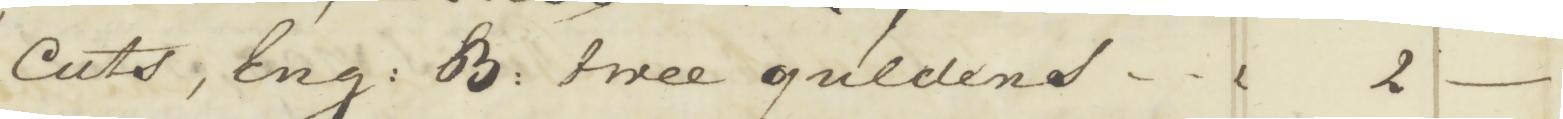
Cuts, Eng: B: twee guldens - - „ 2 —
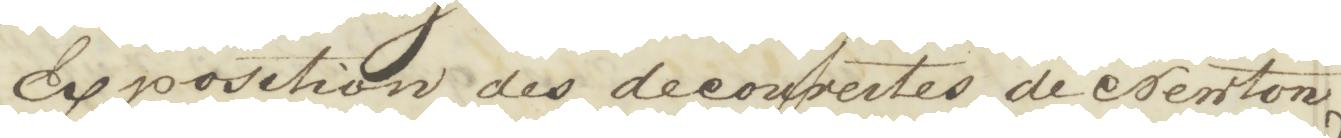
Exposition des decouvertes de Newton
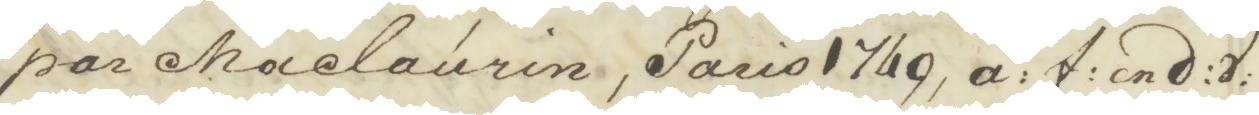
par Maclaurin, Paris 1749, a: f: en d: v:
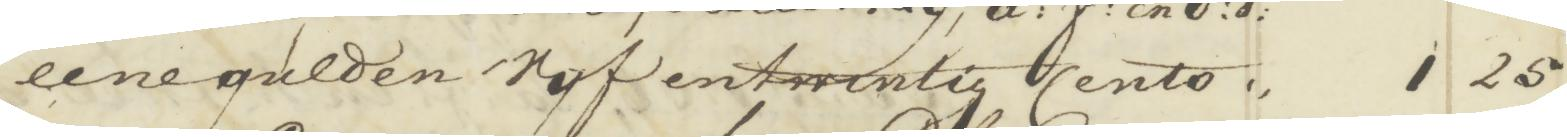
eene gulden vijf entwintig cents „ 1 25
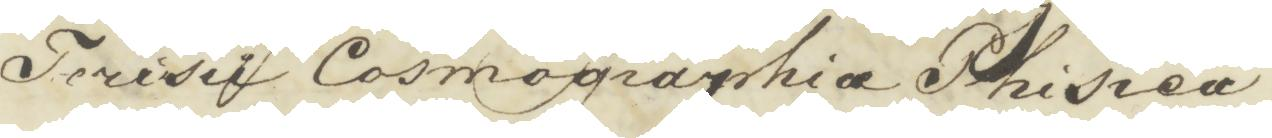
Terisii Cosmographia Phisica
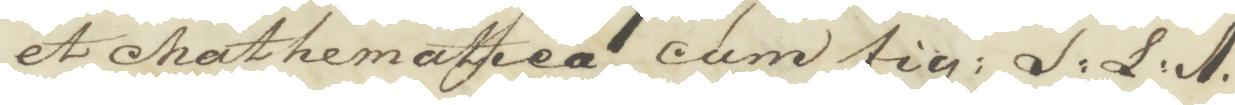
et Mathematica, cum fig: S: L: A.
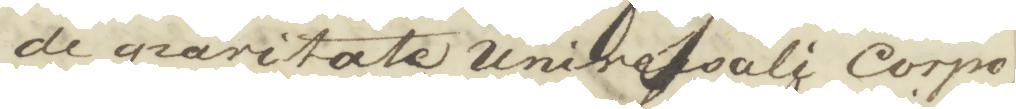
de gravitate universali Corpo
